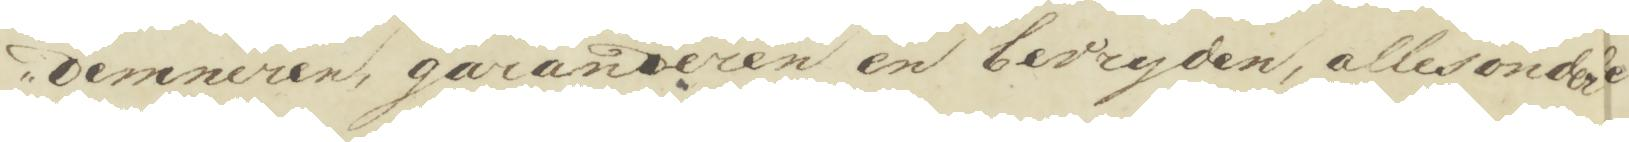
„demneren, garanderen en bevryden, alles onder
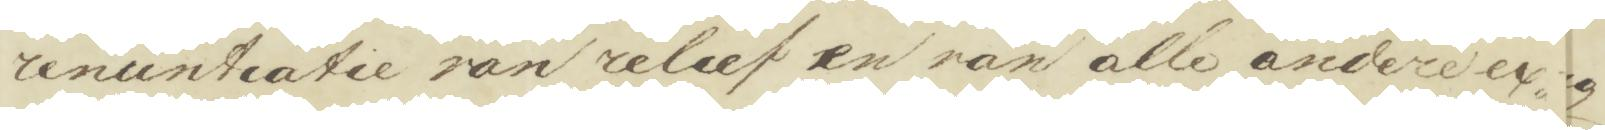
renuntiatie van relief en van alle andere ex„
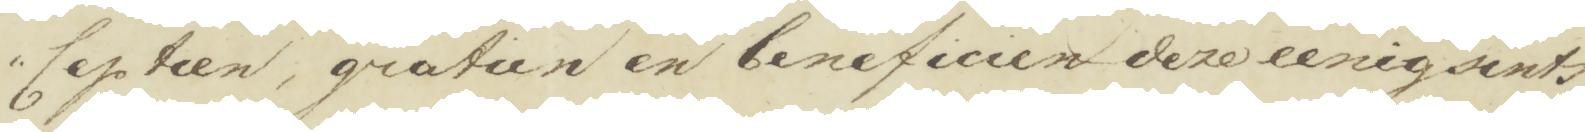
„Ceptien, gratien en beneficien deze eenigsints
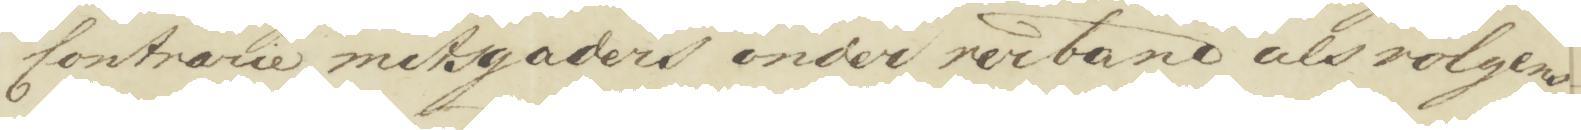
Contrarie, mitsgaders onder verband als volgens
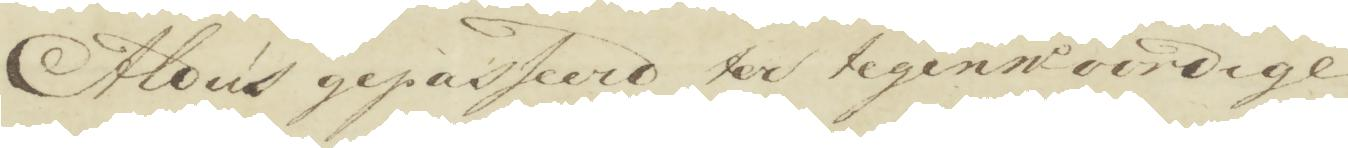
Aldus gepasseerd ter tegenwoordige
